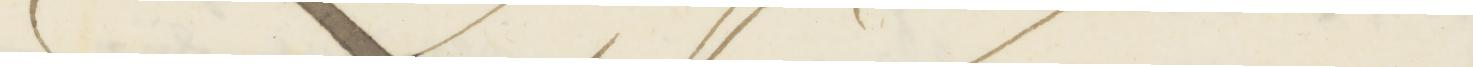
L„L
